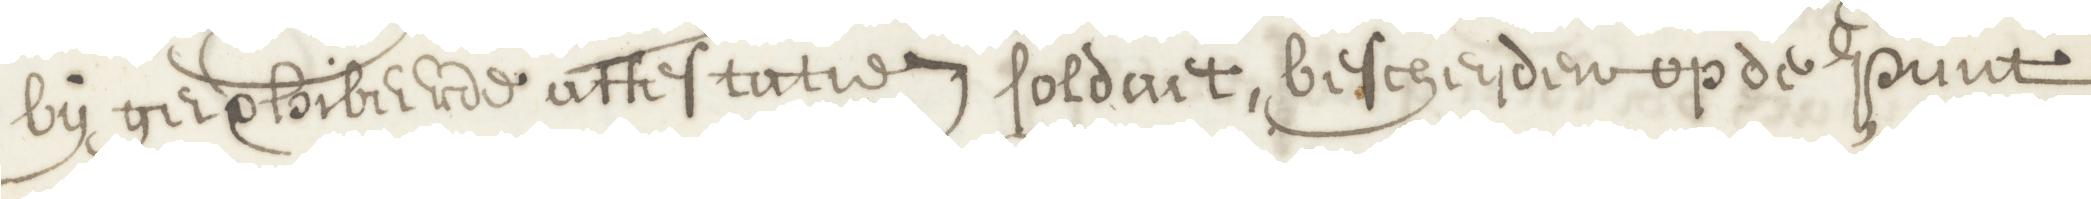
bij geexhibeerde attestatie, soldaet, bescheyden op de punt
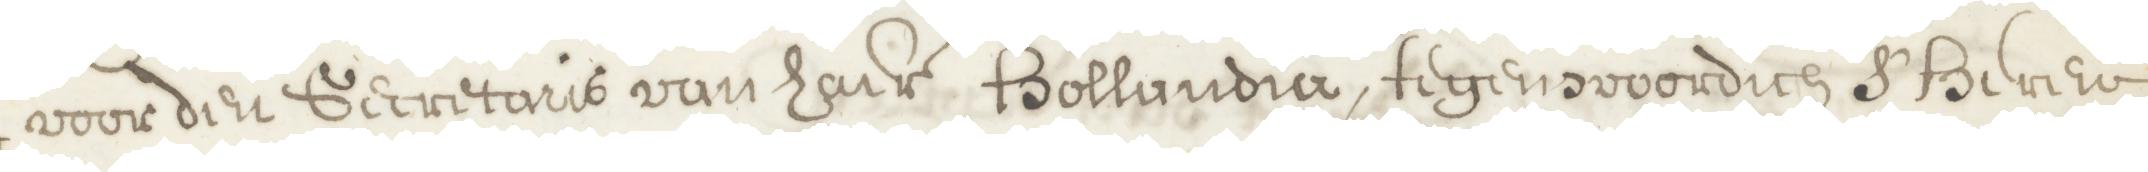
voor den Secretaris van haer Hollandia, tegenwoordig 's Heren
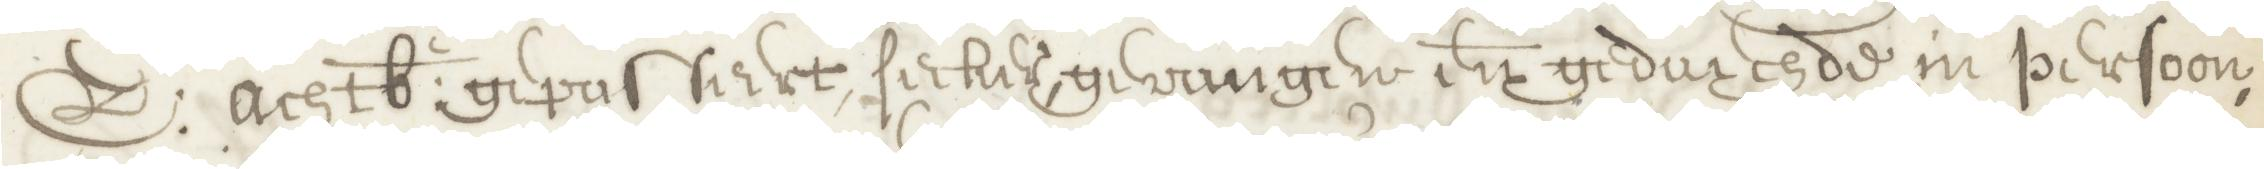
E: agtb: gepasseert, secker, gevangen en gedaegde in persoon,
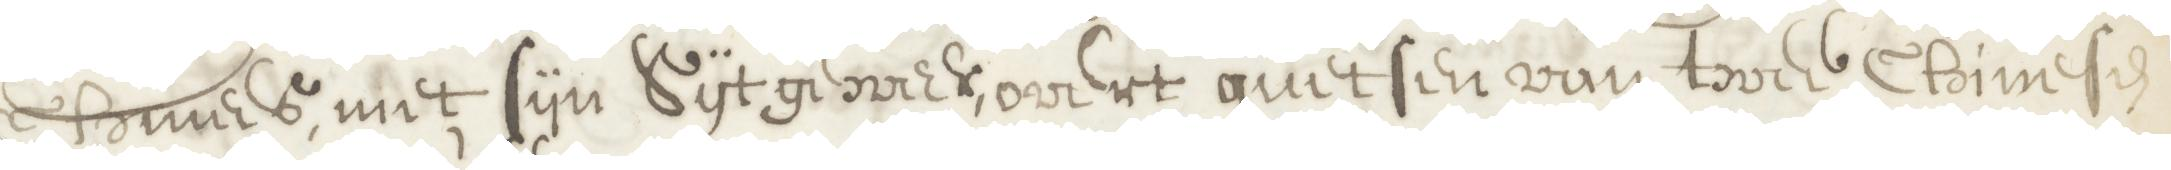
Chinees, met sijn Sijt geweer, over t quetsen van twee Chinesen
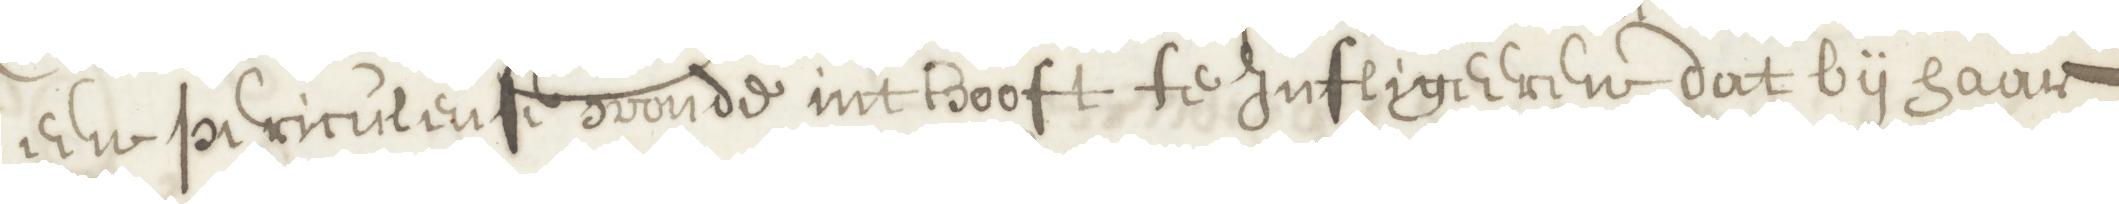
een periculeuse wonde int hooft te Jnfligeeren, dat bij haar
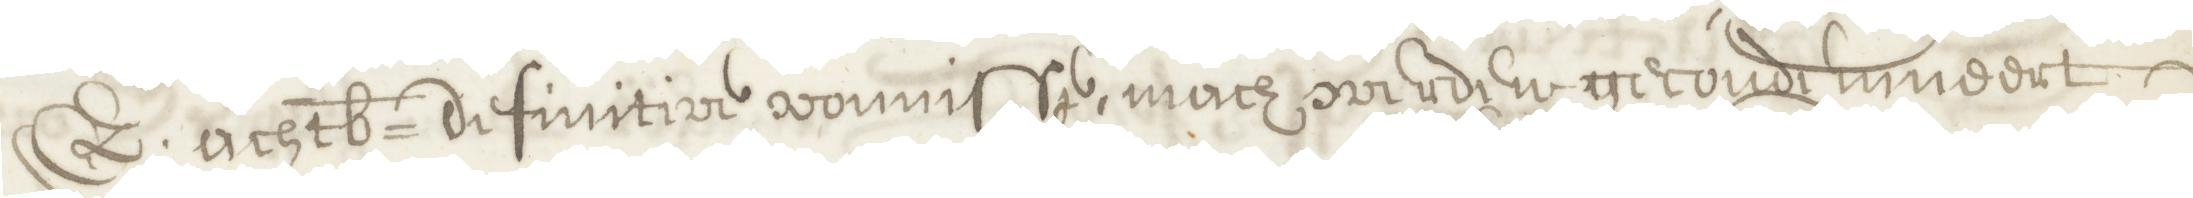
E: agtb= definitive vonnisse, mach werden gecondemneert
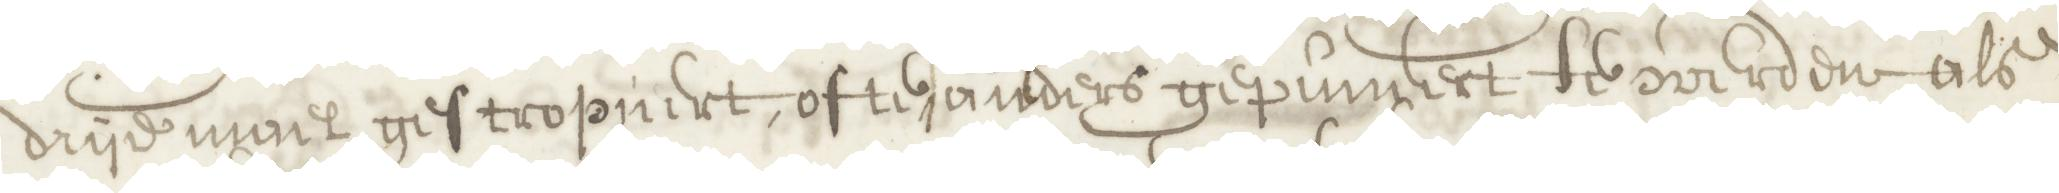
drije mael gestropuert, of te anders gepuneert te werden als
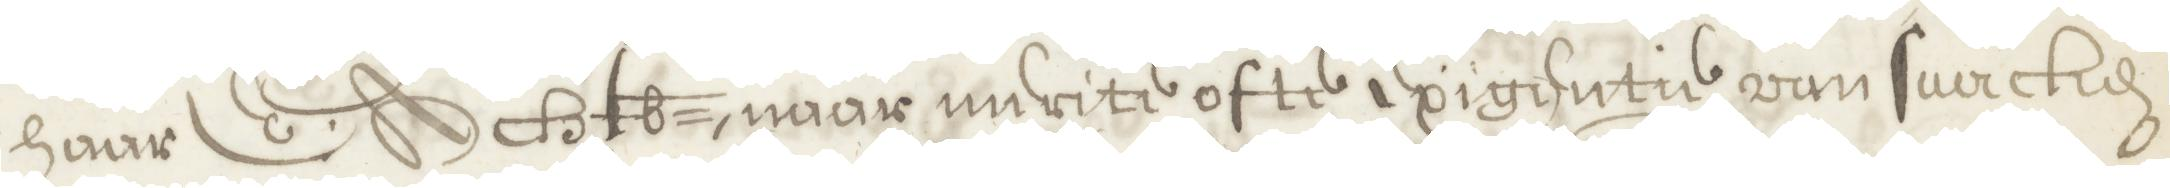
haar E: Achtb=, naar merite ofte exigentie van saacken
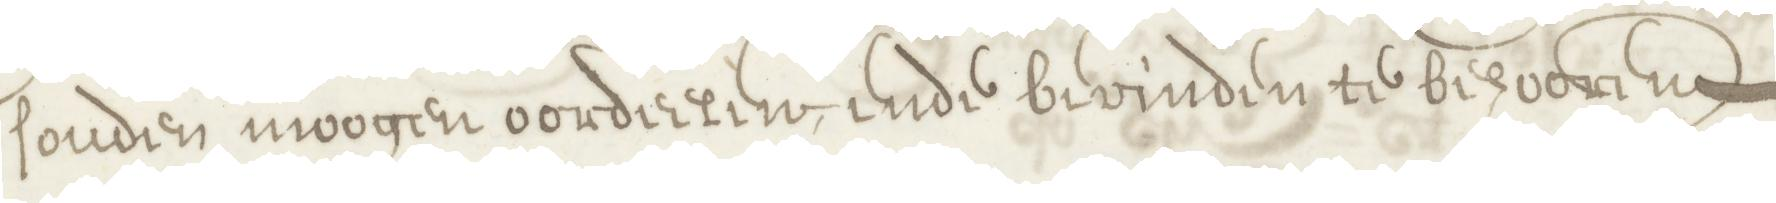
souden moogen oordeelen, ende bevinden te behooren
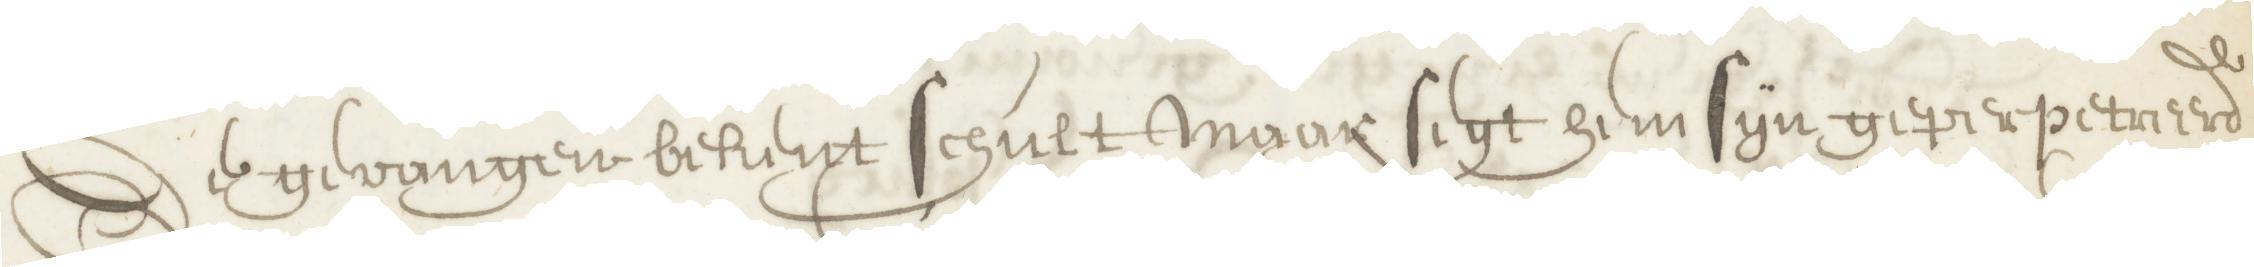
De gevangen bekent schult, maar segt hem sijn geperpetreerd
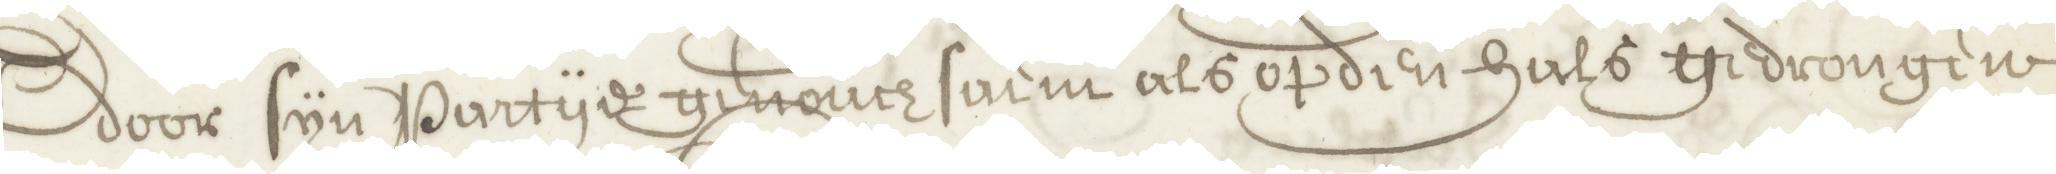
door sijn Partije genouchsaem als op den hals gedrongen
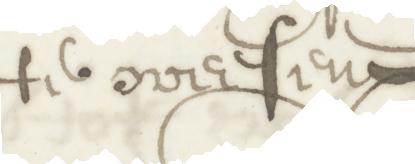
te weesen
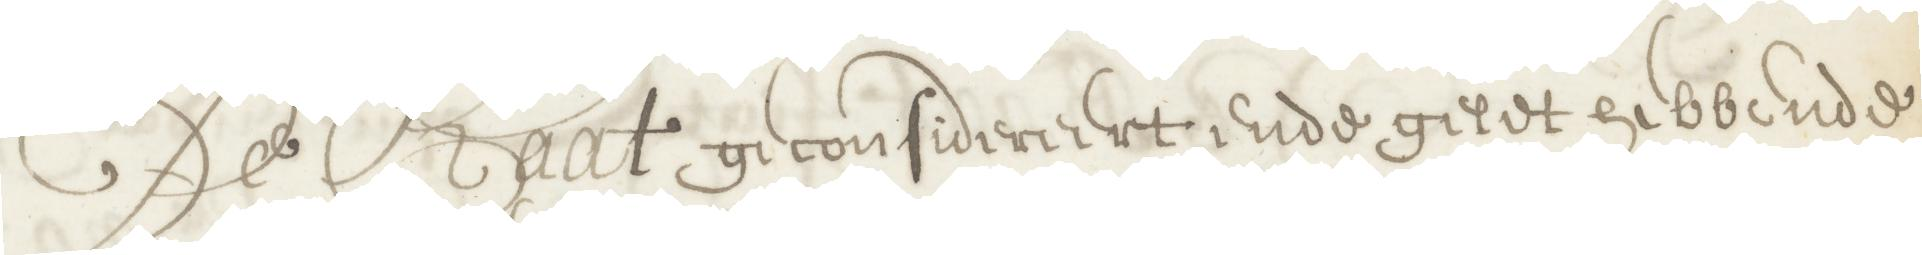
De Raat geconsidereert ende gelet hebbende
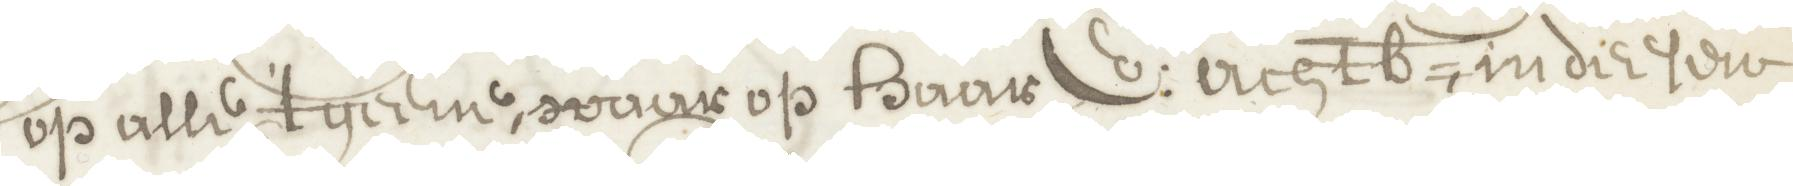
op alle ’t geene, waar op haar E: agtb=, in deesen
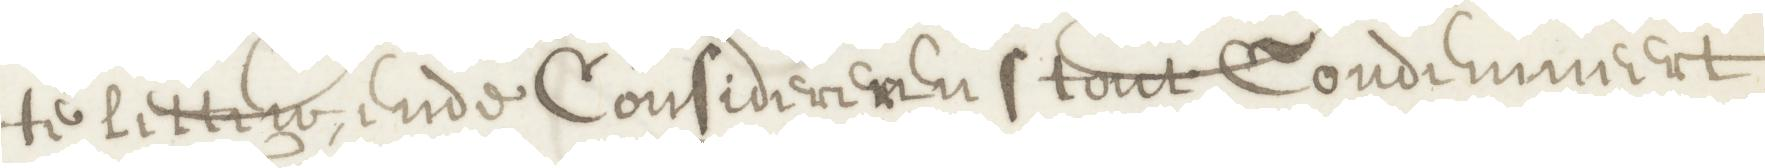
te letten, ende Considereren stont, Condemneert
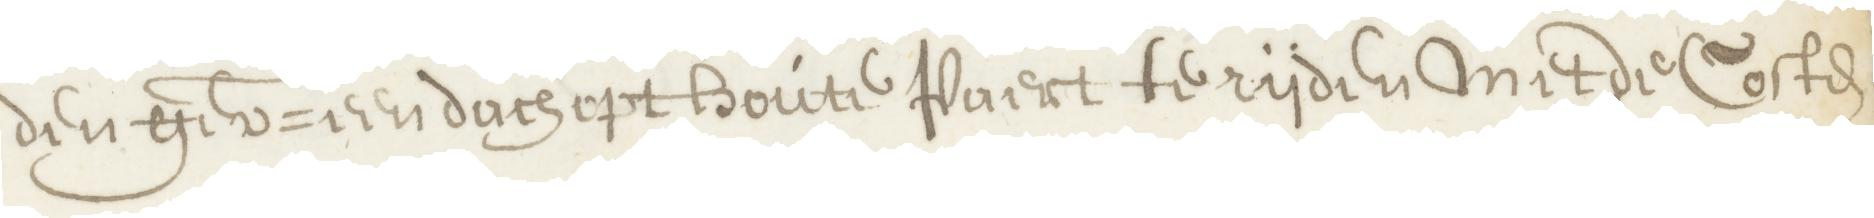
den gev= een dach opt houte paert te rijden met de Costen
